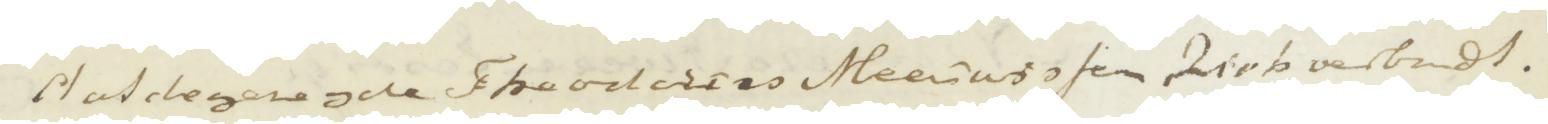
dat de gezegde Theodorius Meeuwssen Zich verbindt.
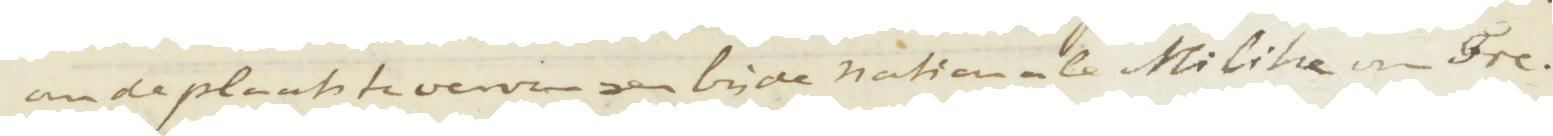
om de plaats te vervangen bij de nationale Militie van Fre
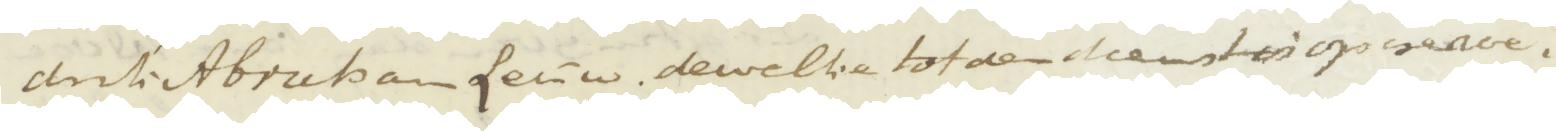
drik Abraham Leuw, dewelke tot den dienst is op geroe
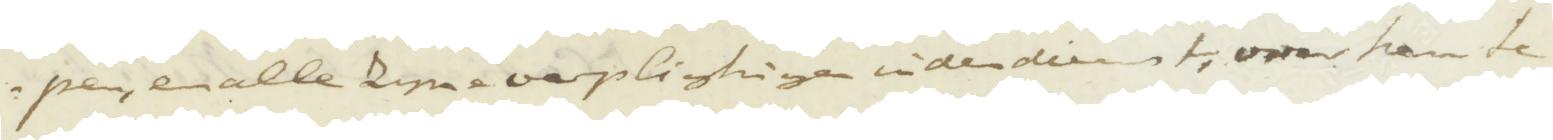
„pen, en alle zyne verpligtingen in den dienst, over hem te
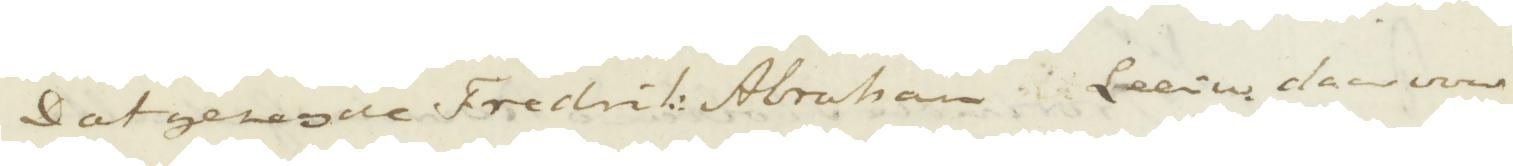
Dat gezegde Fredrik Abraham Leeuw daarvoor
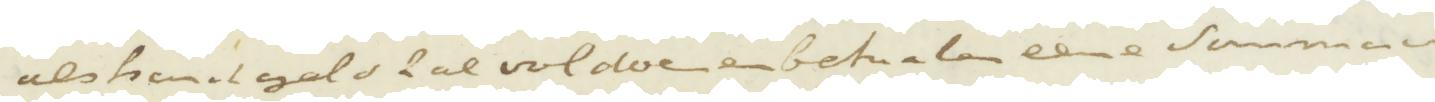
als handgeld zal voldoen en betaalen eene somma v
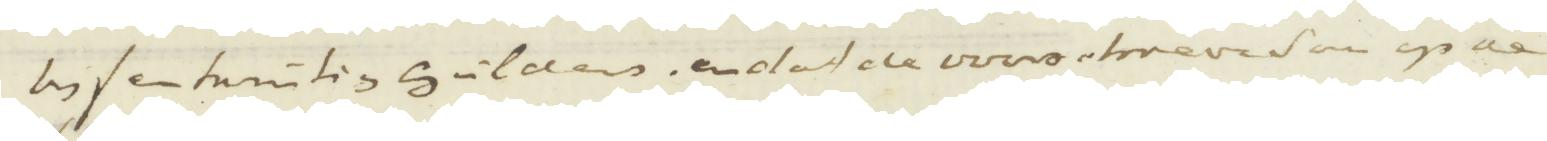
vyf en twintig Guldens, en dat de voorschreve som op de
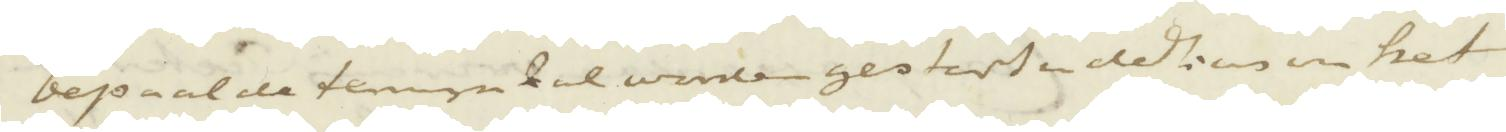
bepaalde termyn zal worden gestort in de kas van het
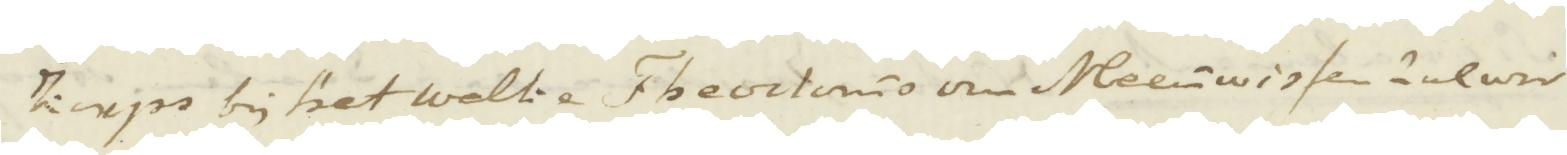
korps bij het welke Theodorus van Meeuwissen zal wor
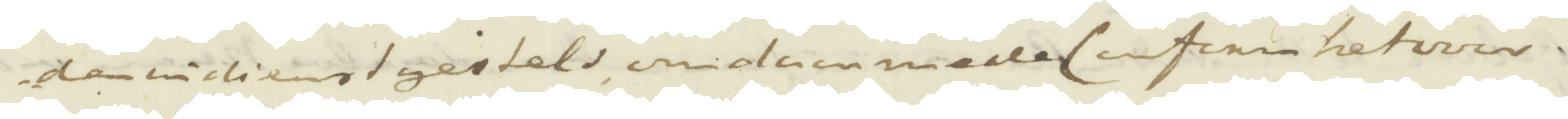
„den in dienst gesteld, om daar mede Conform het voor
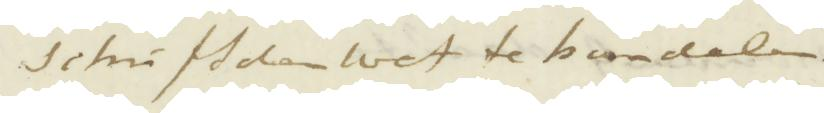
schrift der wet te handelen
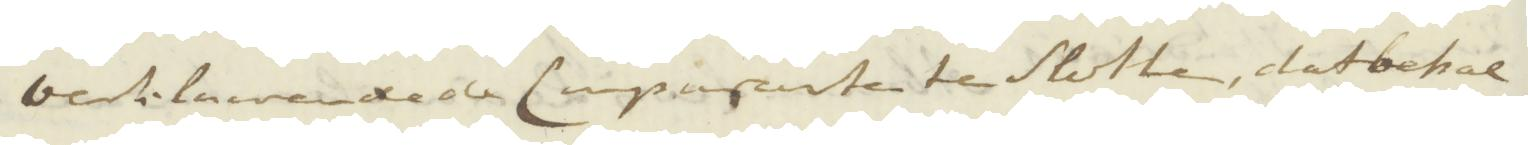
verklaarende de Comparanten ten slotten, dat behal
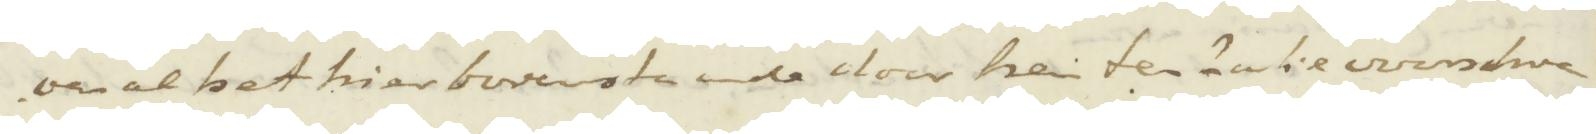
.ven al het hier bovenstaande door hen ter zake voorschre
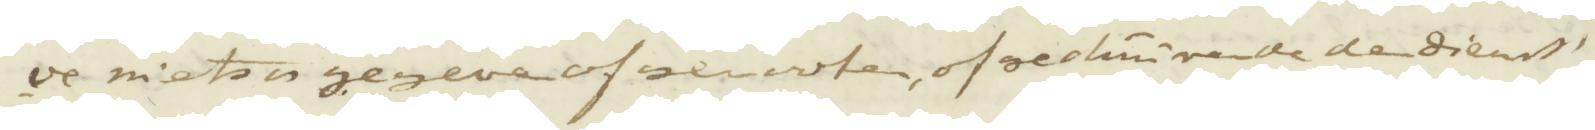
.ve niets is gegeven of genooten, of geduurende den dienst'
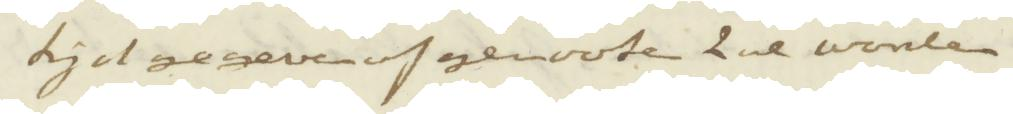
tijd gegeven of genooten zal worden
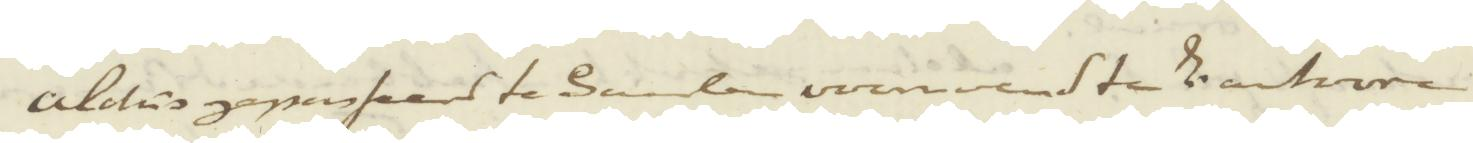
aldus gepasseerd te Haarlem voornoemd ten Kantoore
